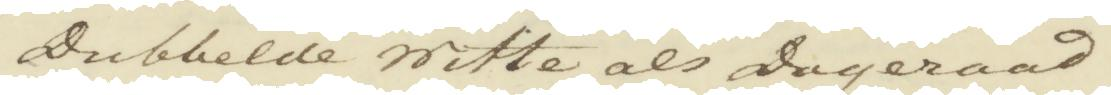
Dubbelde witte als Dageraad
